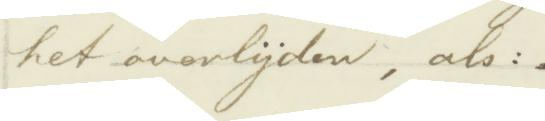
het overlijden, als:
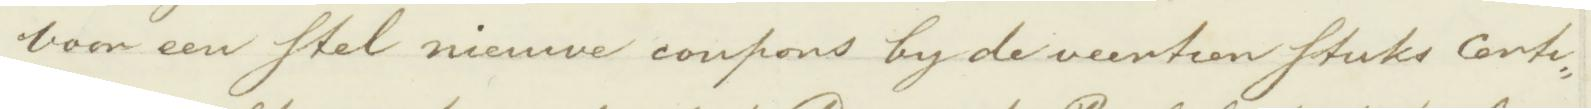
voor een stel nieuwe coupons by de veertien stuks certi„
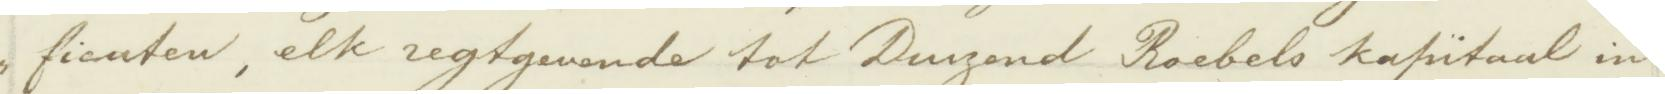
„ficaten, elk regtgevende tot Duizend Roebels kapitaal in
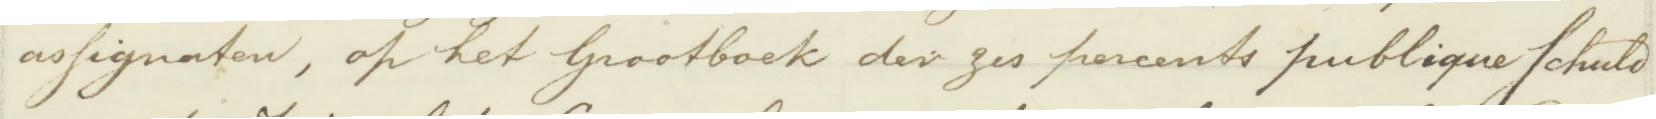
assignaten, op het Grootboek der zes percents publique schuld
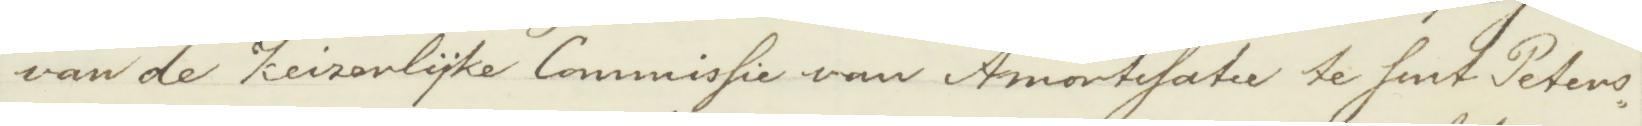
van de Keizerlijke Commissie van Amortifatie te sint Peters„
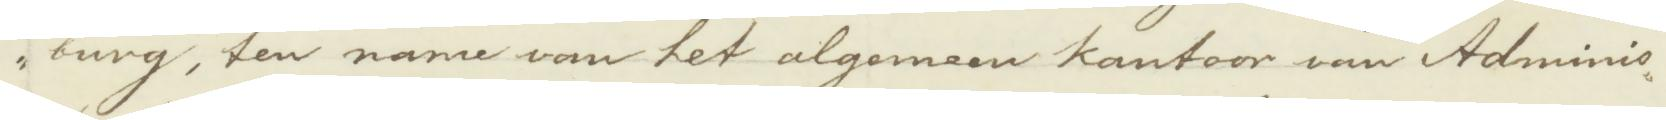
„burg, ten name van het algemeen kantoor van Adminis„
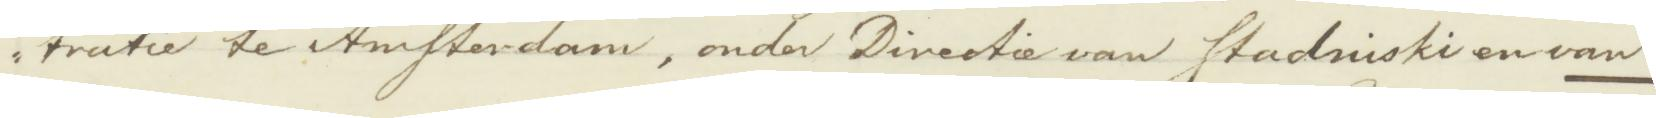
„tratie te Amsterdam, onder Directie van stadniski en van
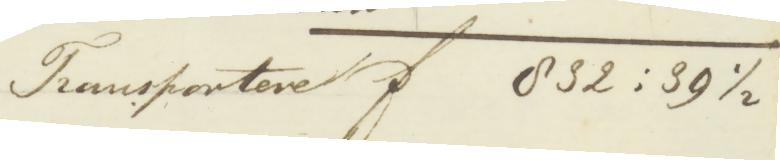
Transportere ƒ 832: 39½
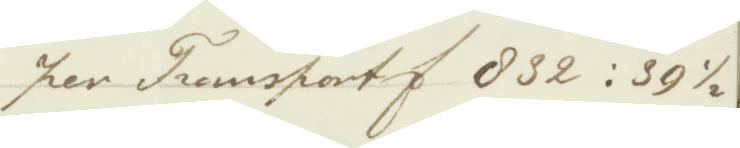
Per Transport ƒ 832: 39½
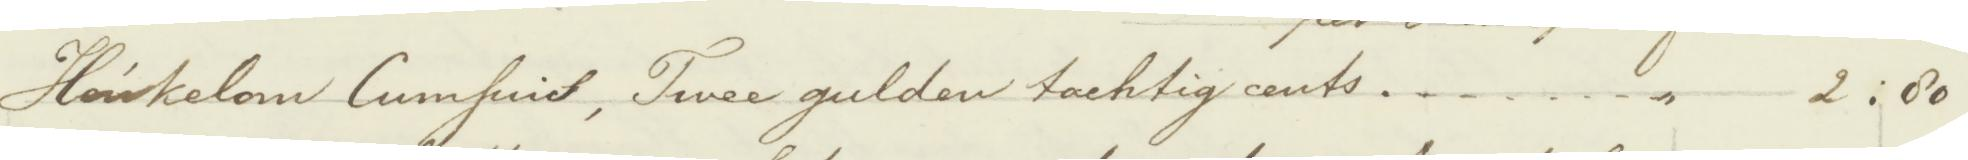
Houkelom Cumsuis, Twee gulden tachtig cents. - - - - - - -„ 2: 80
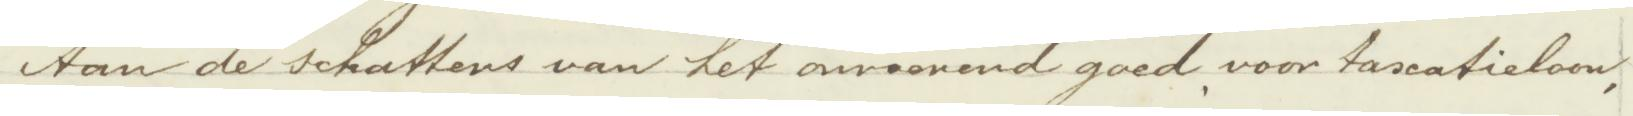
Aan de schatters van het onroerend goed, voor taxatieloon,
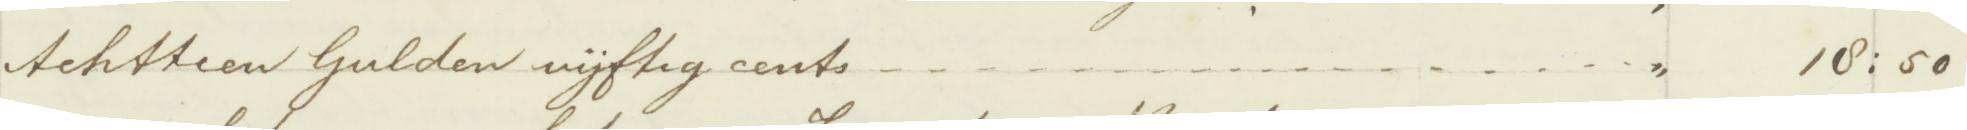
Achttien Gulden vijftig cents - - - - - - - - - - - - - - - - - - „ 18: 50
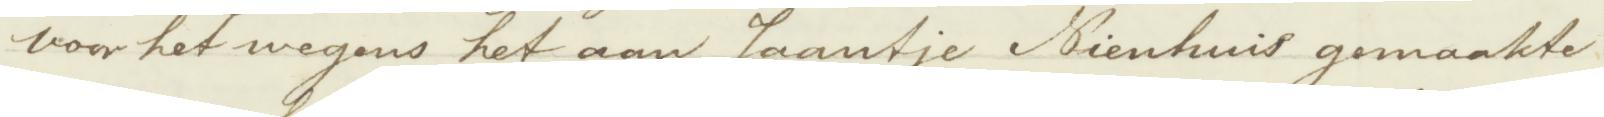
voor het wegens het aan Jaantje Nieuhuis gemaakte
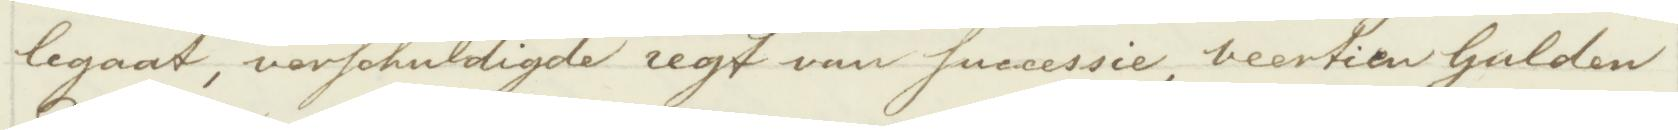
legaat, verschuldigde regt van successie, veertien Gulden
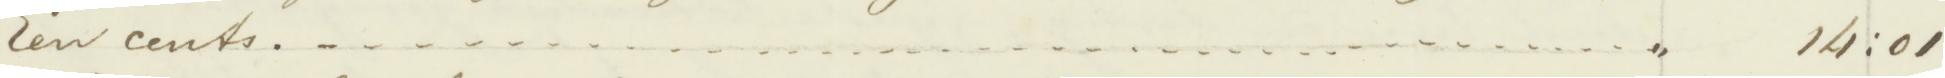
Een cents. - - - - - - - - - - - - - - - - - - - - - - - - - - - - - - - - - - - - - „ 14: 01
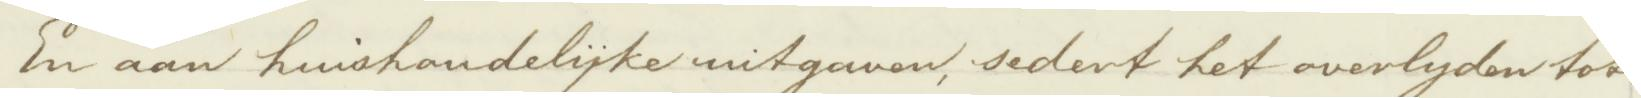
En aan huishoudelijke uitgaven, sedert het overlyden tot
